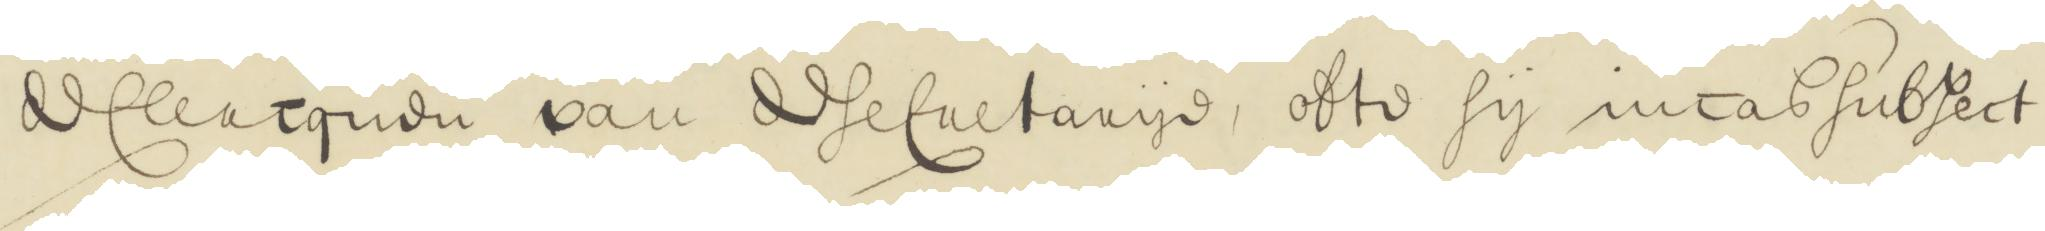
de Clercquen van de secretarije, ofte sij incas subject
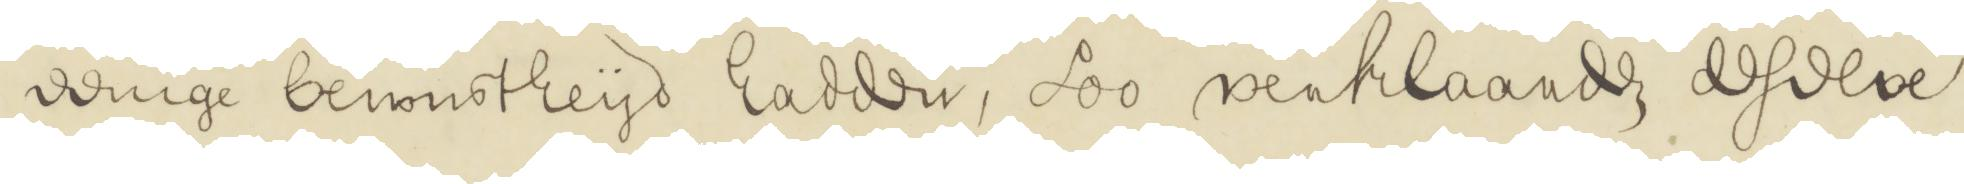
eenige bewustheijd hadden, soo verklaarden deselve
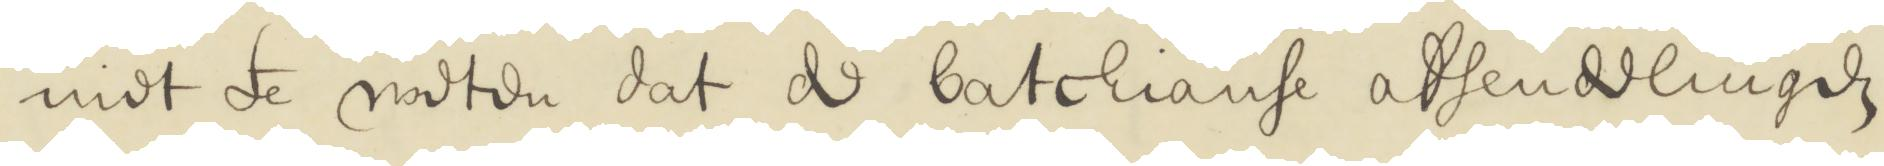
niet te weten dat de batchianse afsendelingen
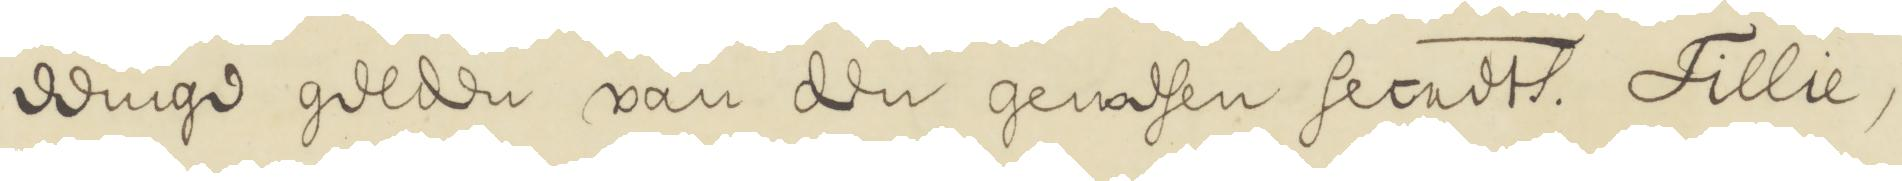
eenige gelden van den gewesen secrets. Tillie
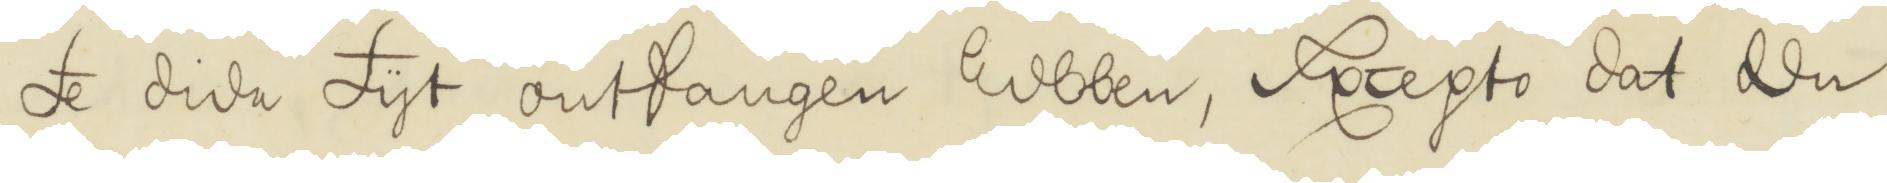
te dier tijt ontfangen hebben, Excepto dat den
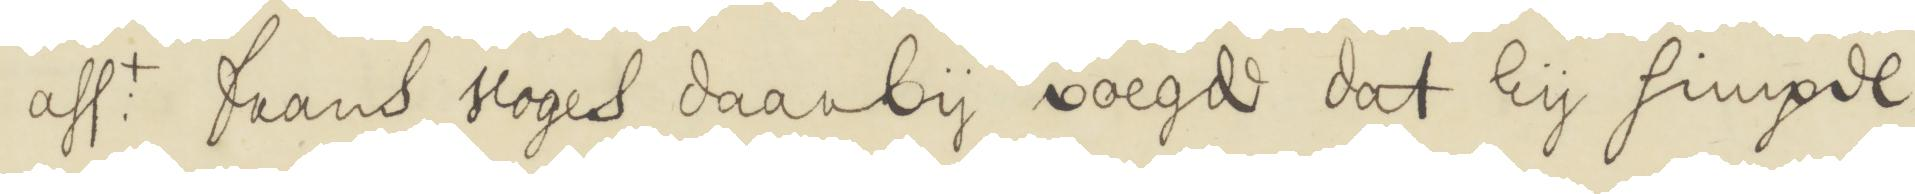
ass:t frans voges daar bij voegde dat hij simpel
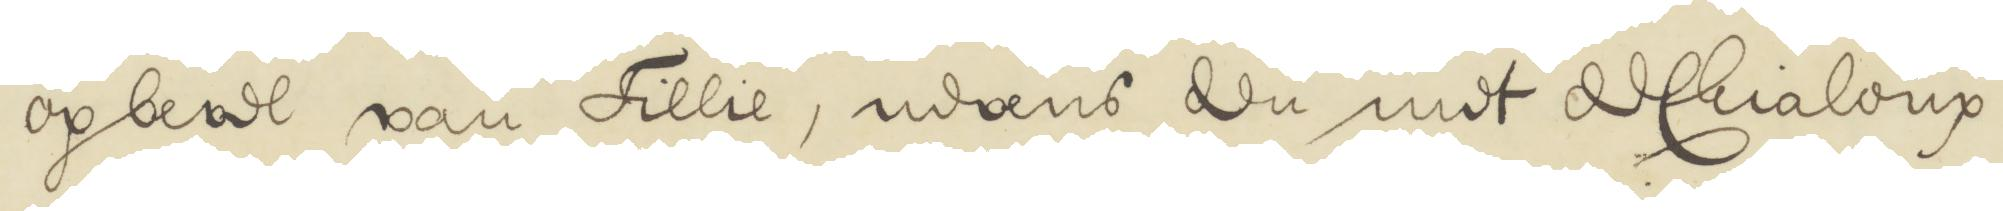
op bevel van Tillie, nevens den met de Chialoup
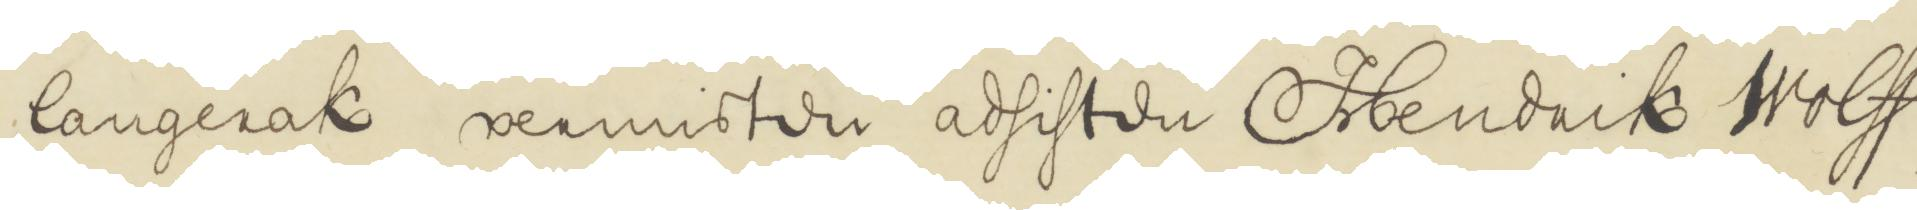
langerak vermisten adsisten Hendrik Wolff
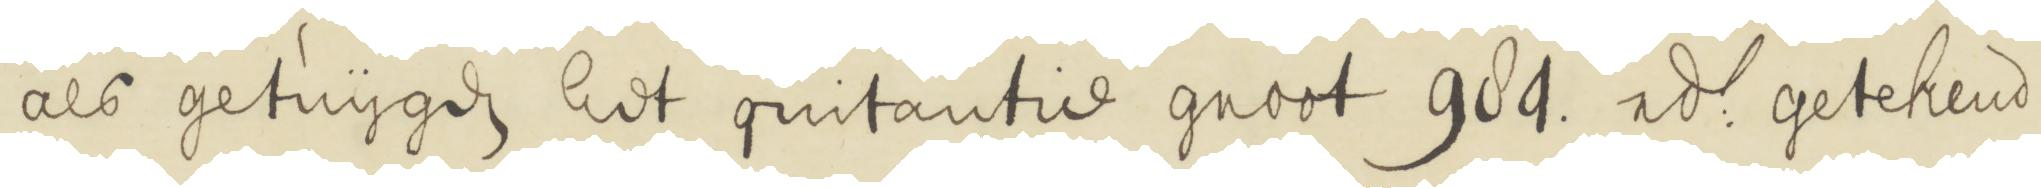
als getuijgen het quitantie groot 984. rd:s getekend
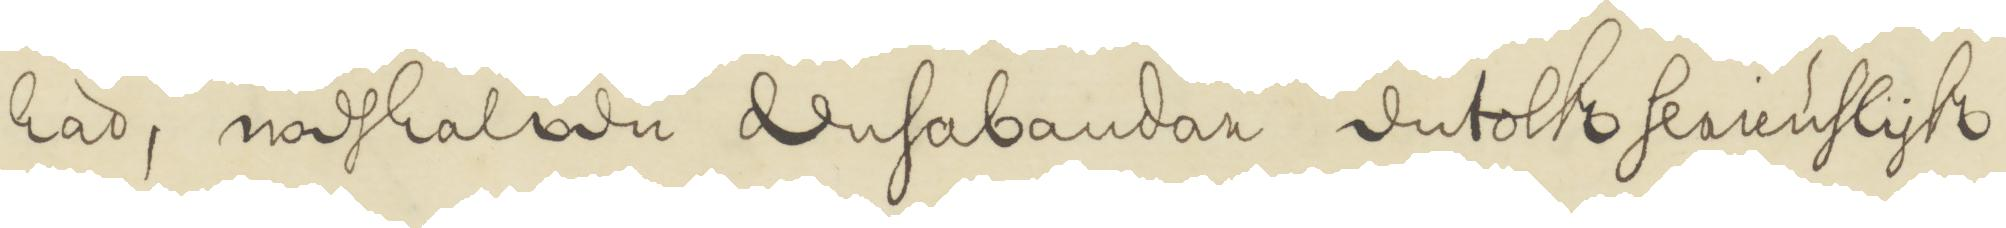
had, weshalven den sabandar en tolk serieuslijk
